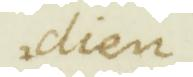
„dien
